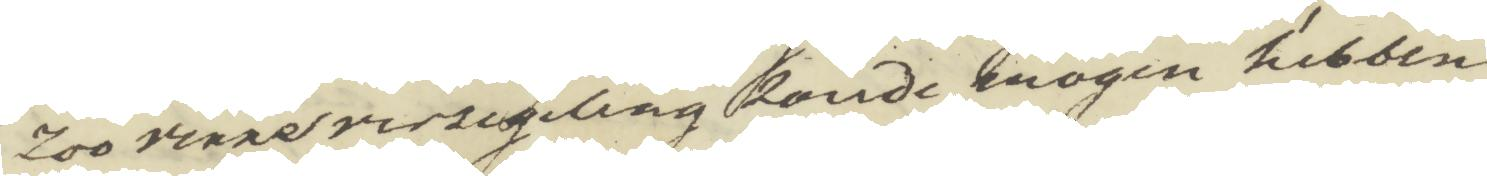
zoo verre verzegeling zoude mogen hebben
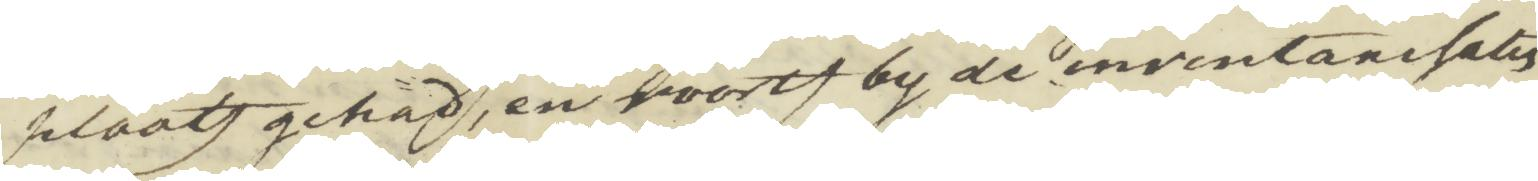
plaats gehad, en voorts by de inventarisatie
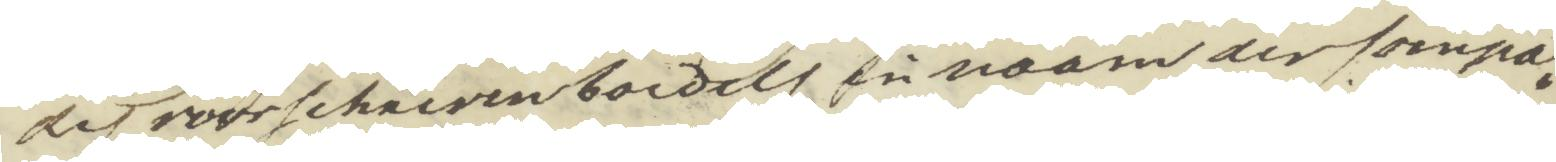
des voorschreven boedels in naam der Compa„
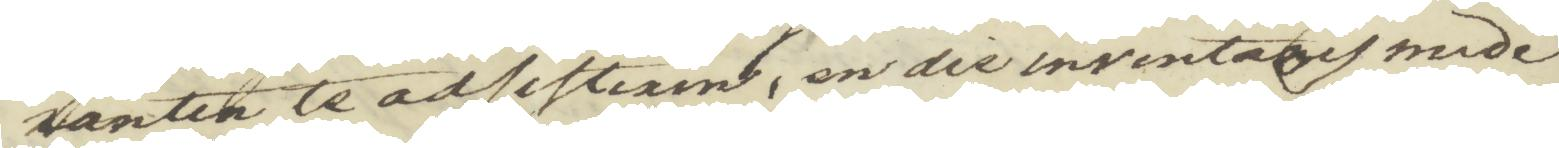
ranten te adsisteren, en die inventaris mede
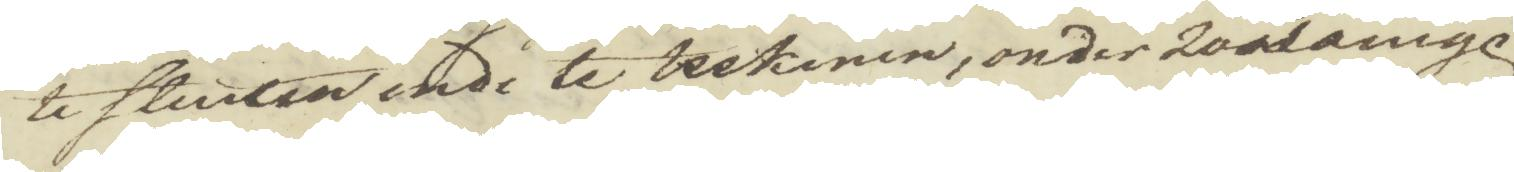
te sluiten ende te teekenen, onder zoodanige
